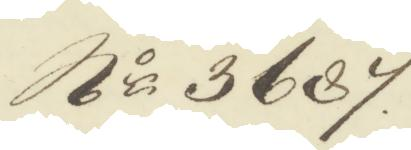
N=o 3687.
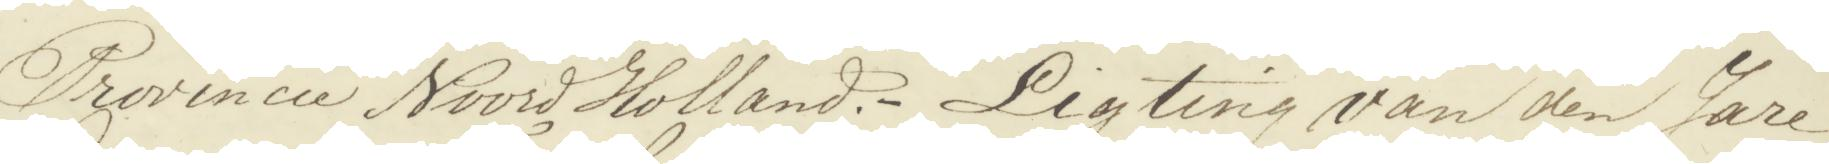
Provincie Noord Holland. - Ligting van den Jare
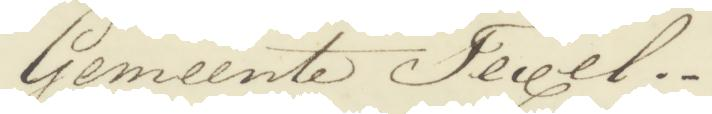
Gemeente Texel. -
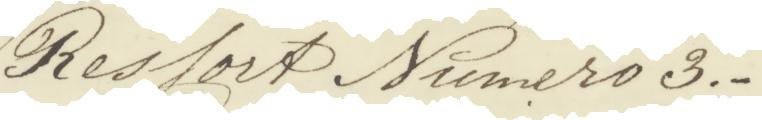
Ressort Numero 3. -
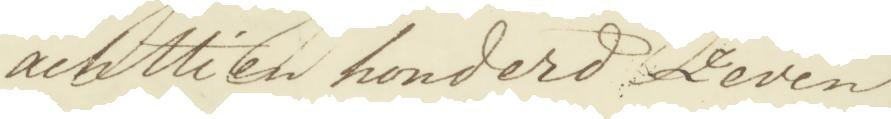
achttien honderd zeven
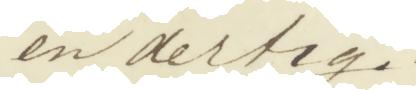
en dertig.
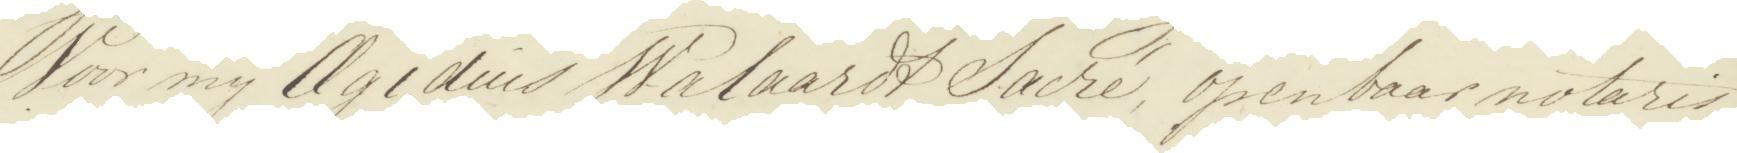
Voor my AEgidius Walaardt Sacré, openbaar notaris,
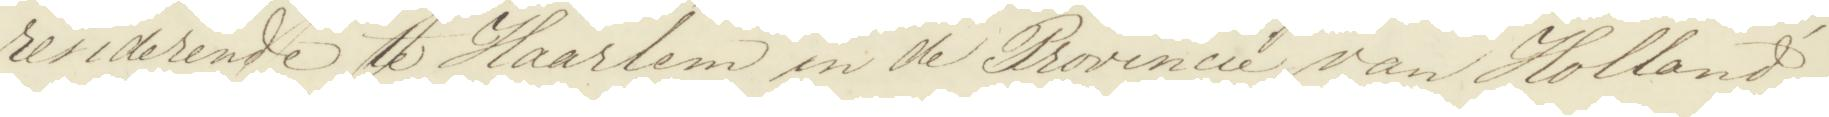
residerende te Haarlem in de Provincie van Holland,
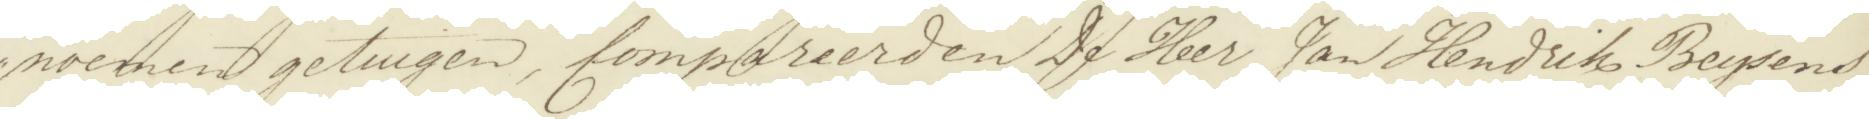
noemen getuigen, Compareerden De Heer Jan Hendrik Beysens,
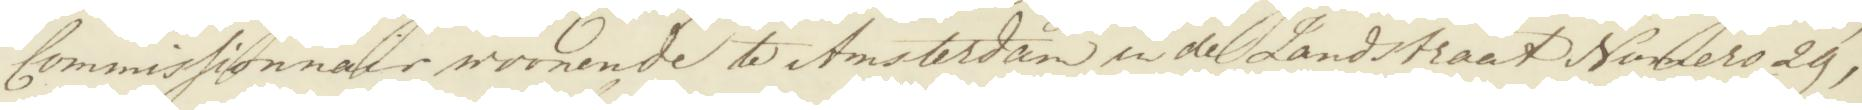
Commissionnair woonende te Amsterdam in de Zandstraat Numero 29,
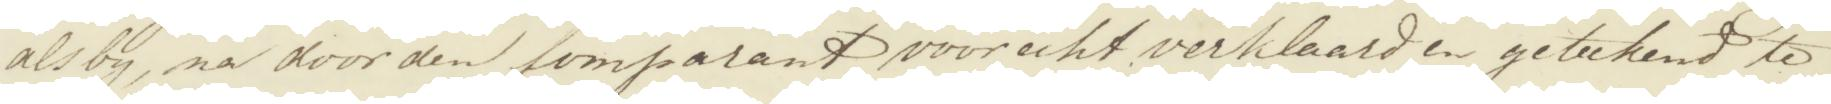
als by, na door den comparant voor echt verklaard en geteekend te
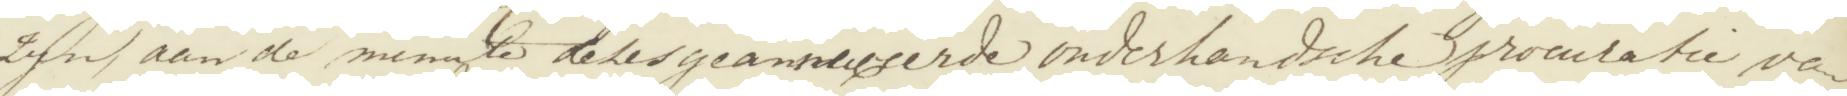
zyn, aan de minute dezes geannexeerde onderhandsche procuratie van
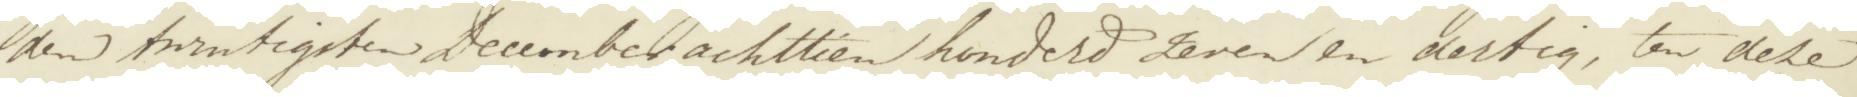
den twintigsten December achttien honderd zeven en dertig, ten deze
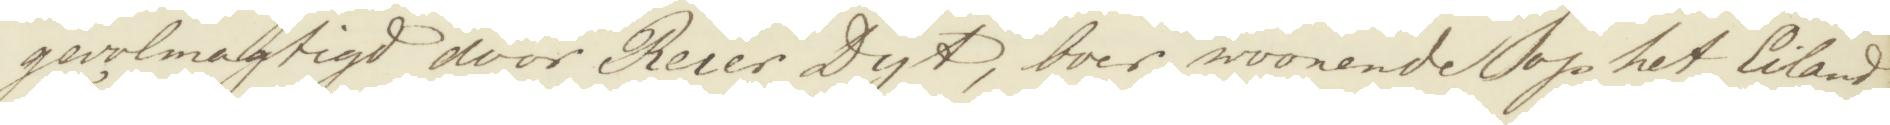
gevolmagtigd door Reier Dyt, boer, woonende op het Eiland
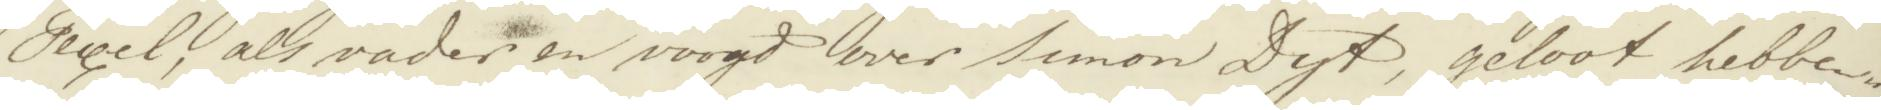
Texel, als vader en voogd over Simon Dyt, geloot hebben
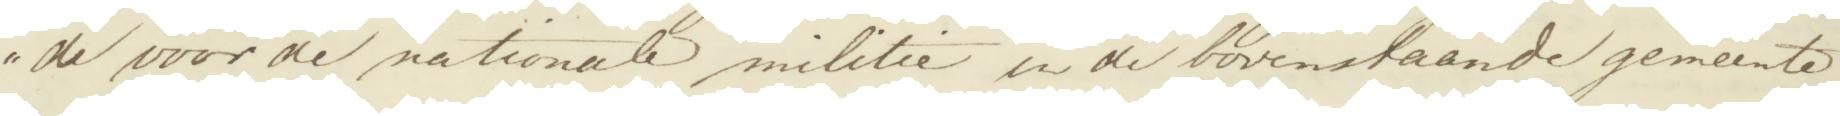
„de voor de nationale militie in de bovenstaande gemeente
